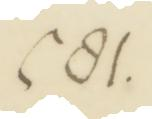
581.
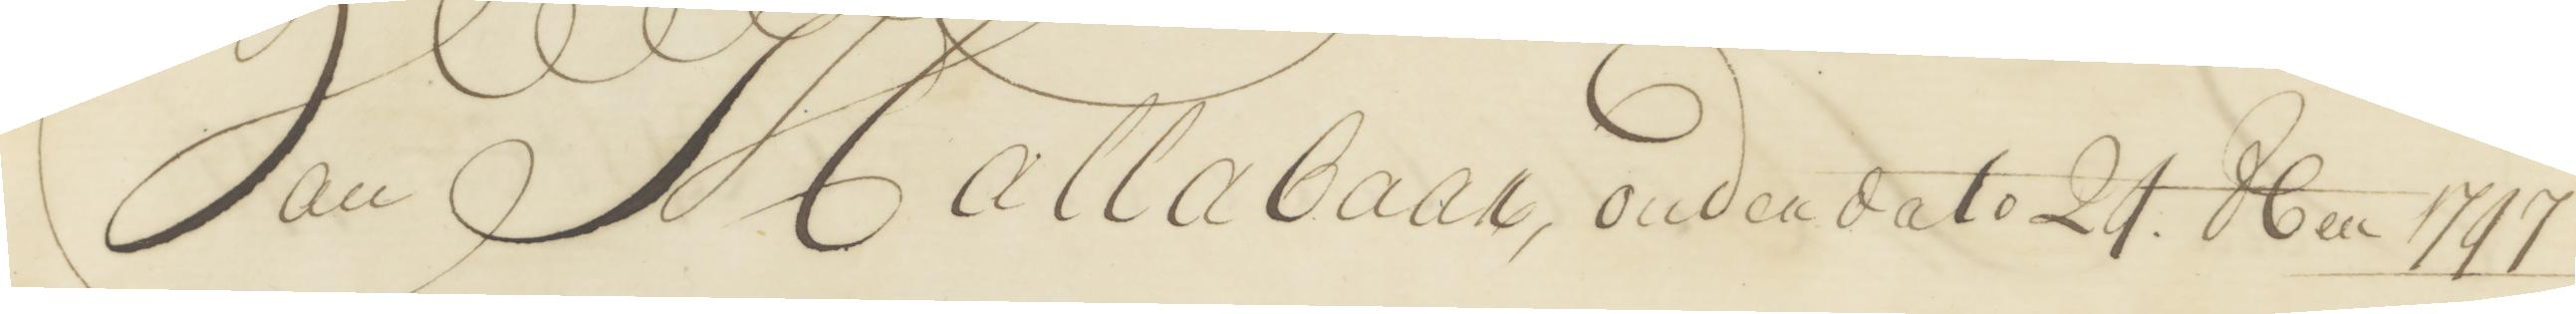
Van Mallabaar, onder dato 24. 8ber 1747
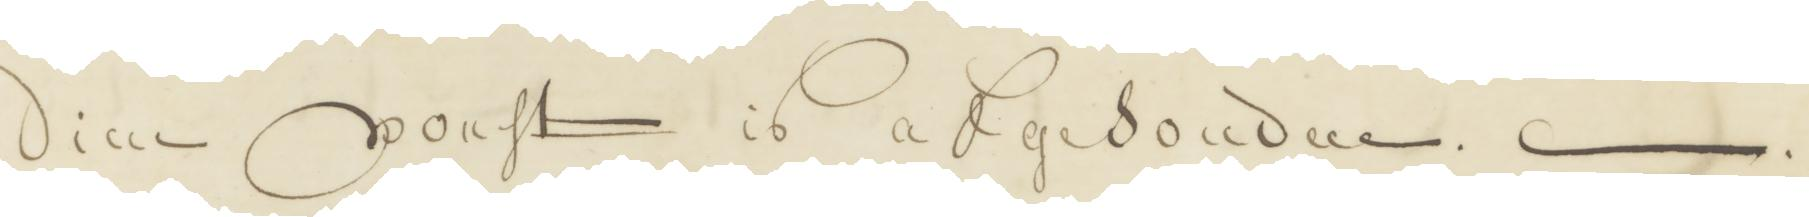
dien vorst is afgesonden. —.
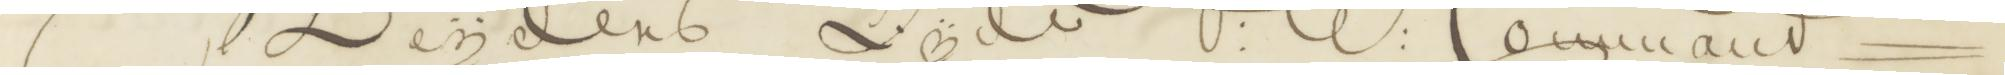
Weijders zijde d: E: Command=r
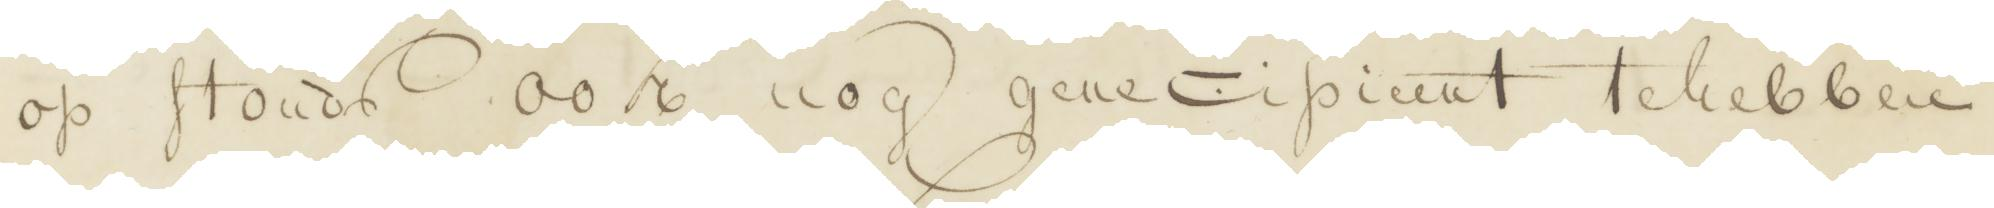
op stonds ook nog gerecipieert tehebben
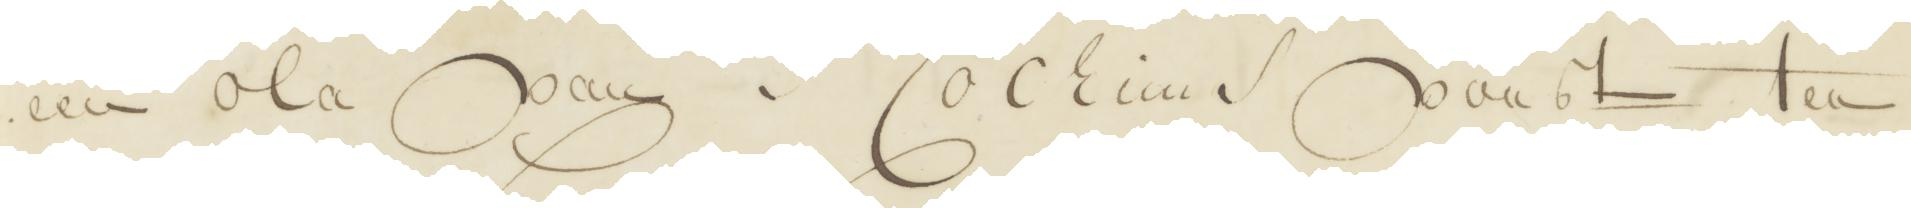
een ola van 's Cochims vorst ter
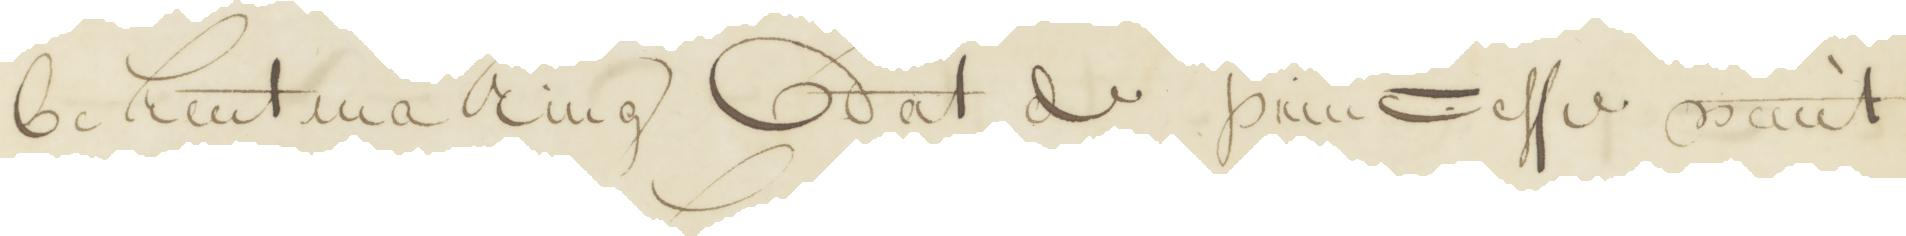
bekentmaking dat de princesse van't
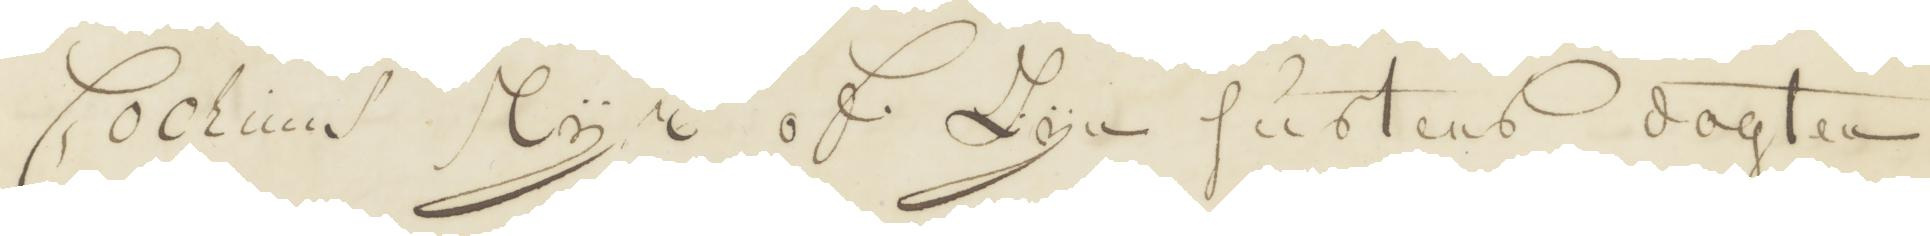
Cochims rijk of zijn susters dogter
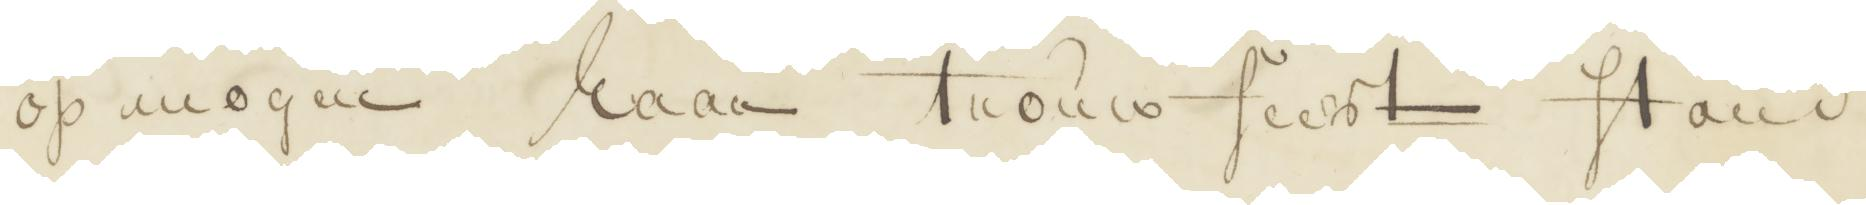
op mogen haar trouw feest stand
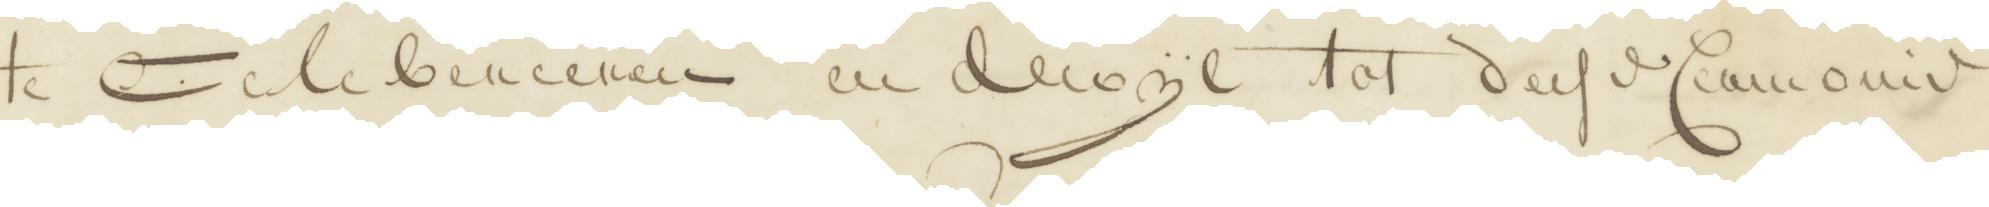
te celebereeren en dewijl tot deese Cermonie
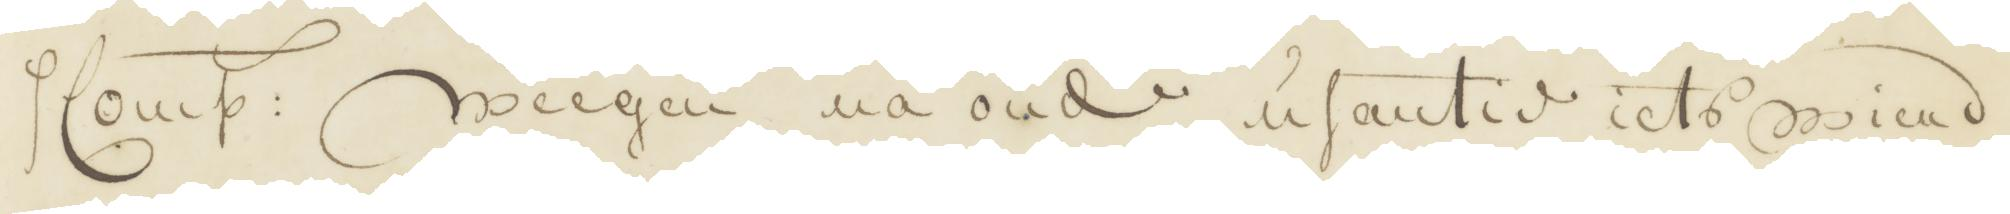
sComp:s weegen na oude usantie iets wierd
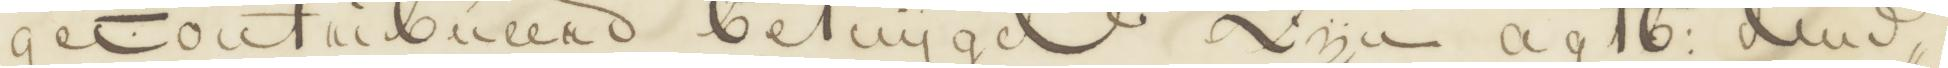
gecontribueerd betuijgde zijn agtb: dene„
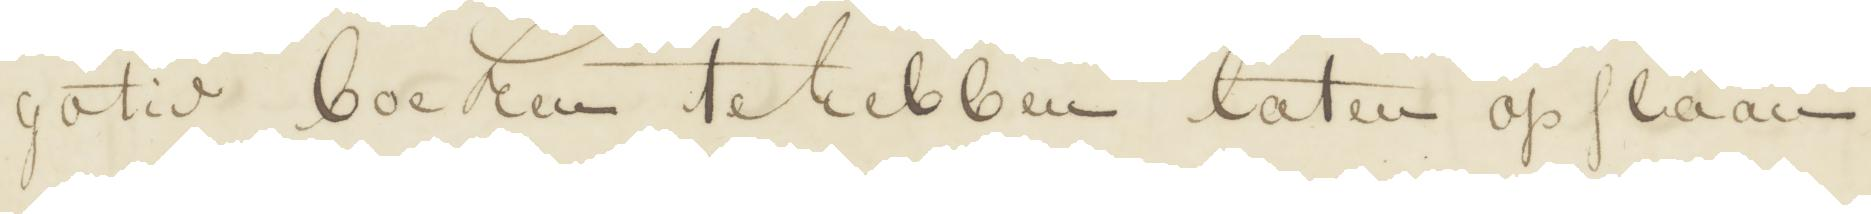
gotie boeken te hebben laten opslaan
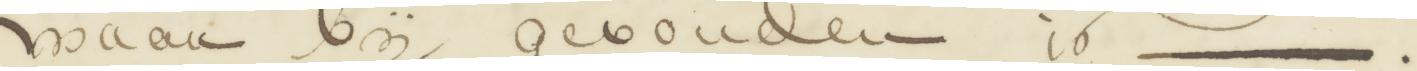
waar bij gevonden is —.
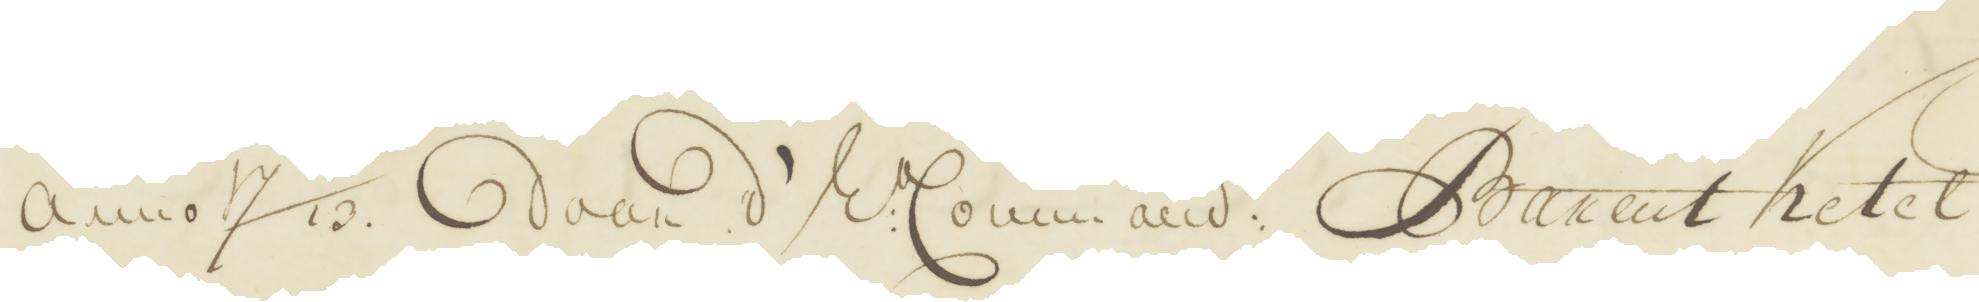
anno 17 12/13. door d’ h:r Command:r Barent Ketel
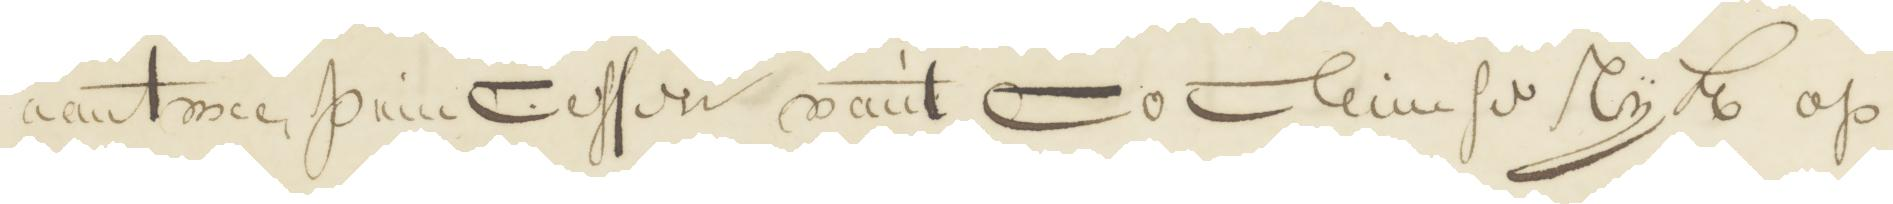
aan twee princessen van’t cochimse rijk op
